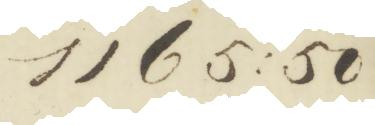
1165:50
